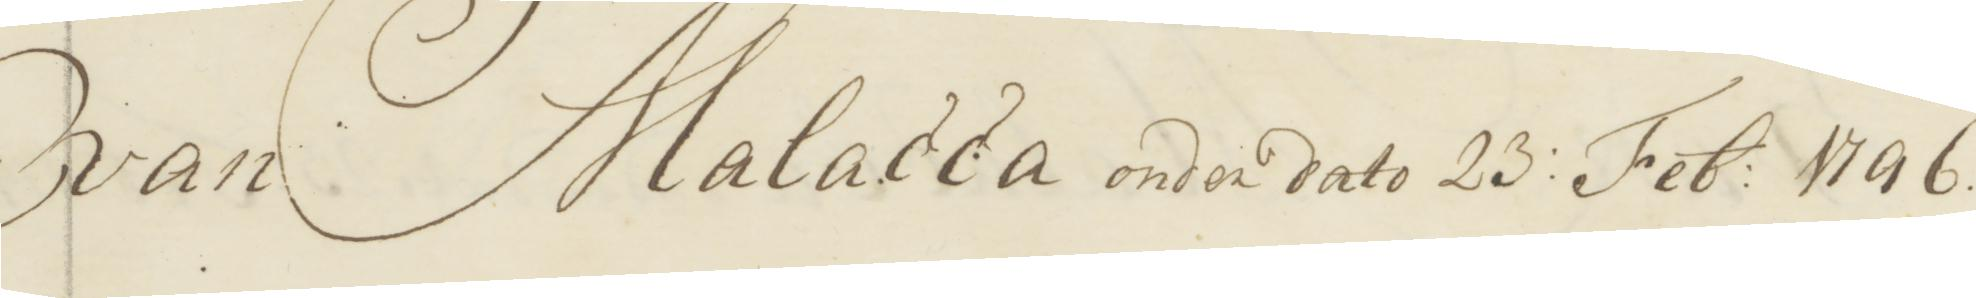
van Malacca onder dato 23: Feb: 1746.
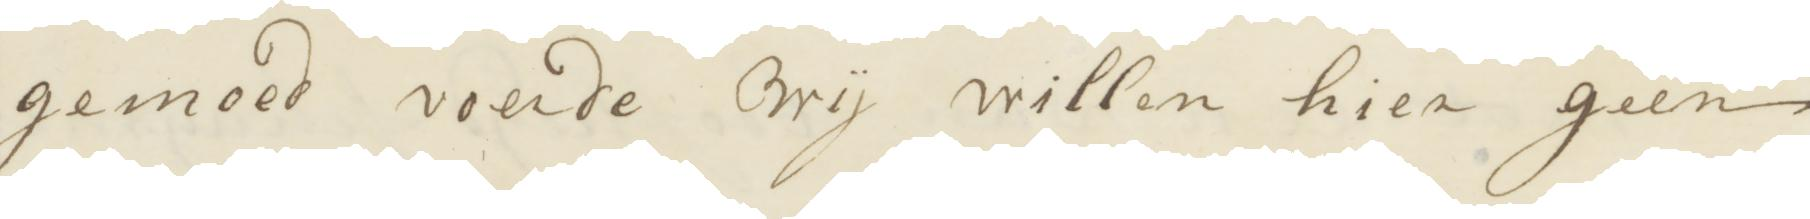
gemoed voerde wij willen hier geen
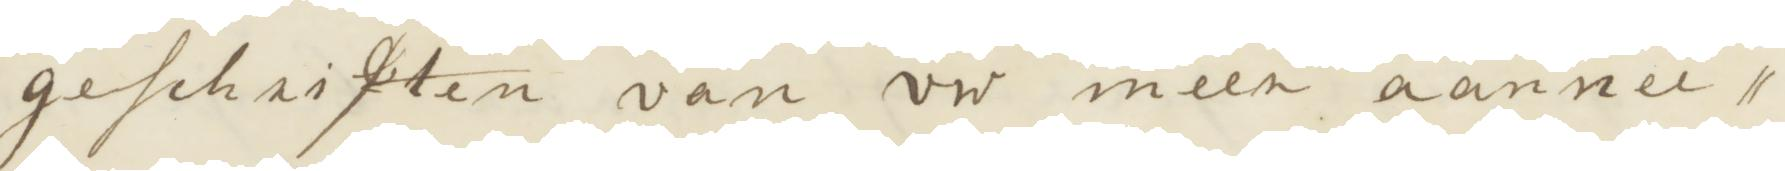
geschriften van vw meer aannee„
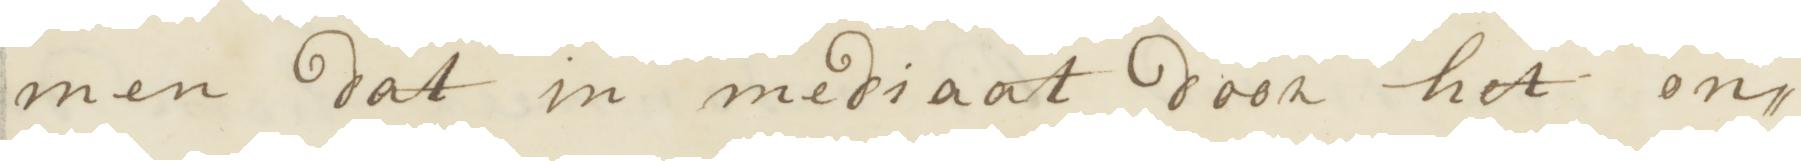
men dat in mediaat door het on„
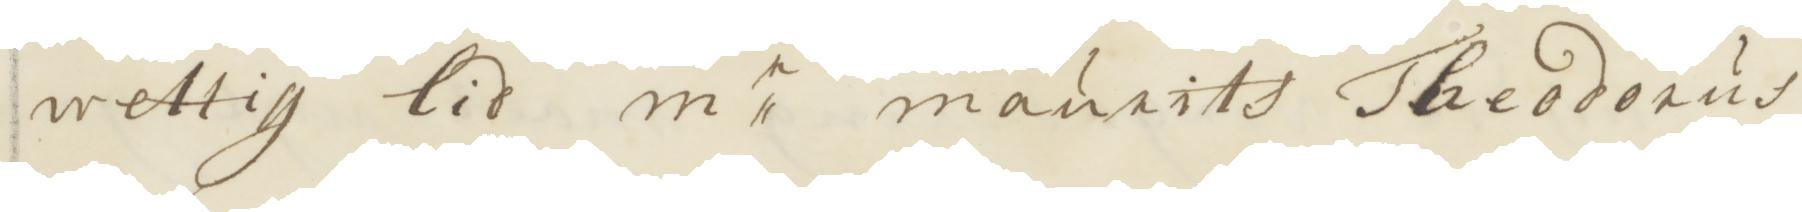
wettig lid m„r maurits Theodorus
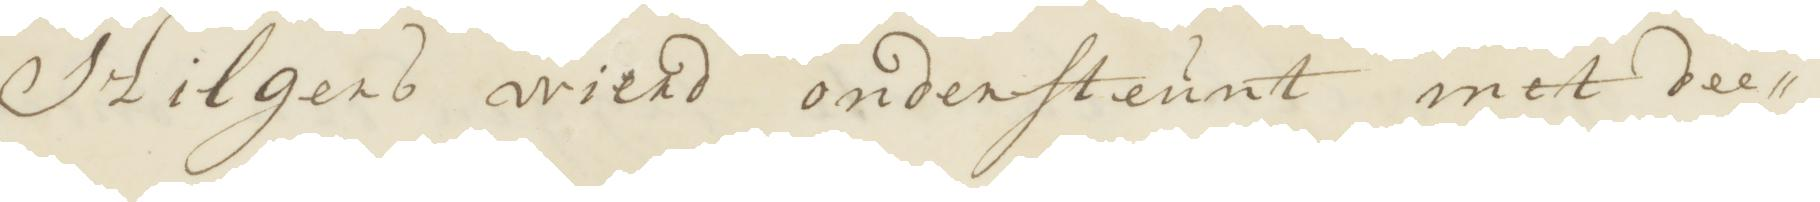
Hilgers wierd ondersteunt met dee„
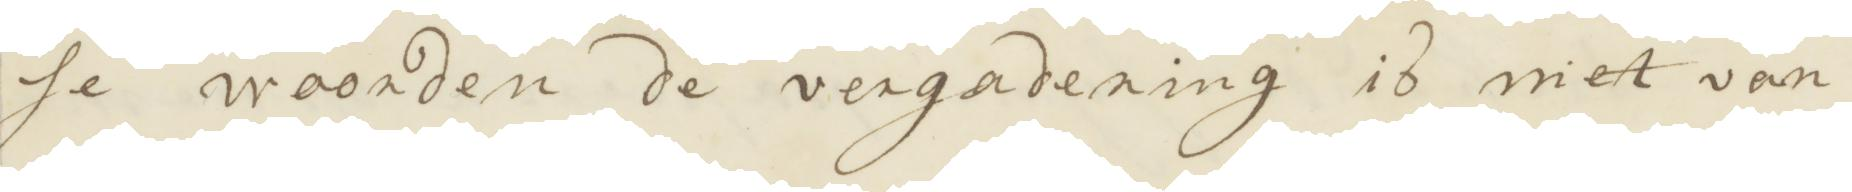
se woorden de vergadering is niet van
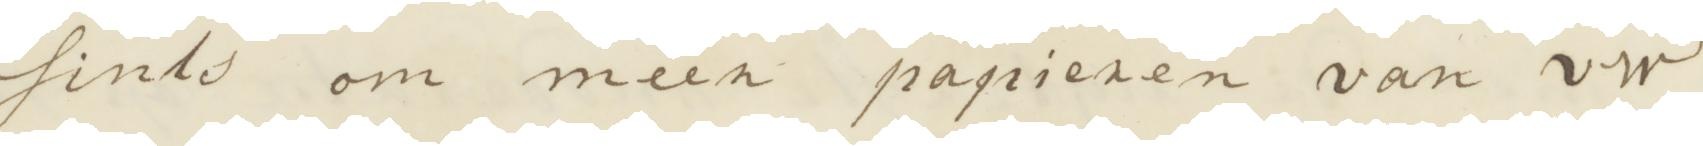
sints om meer papieren van vw
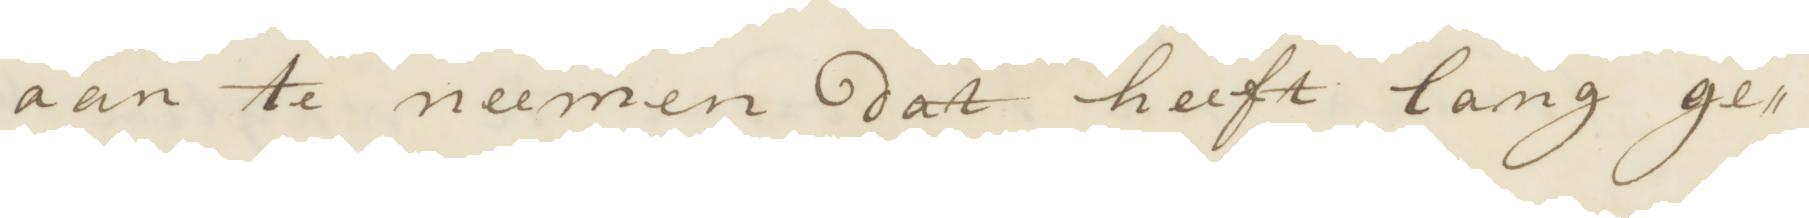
aan te neemen dat heeft lang ge„
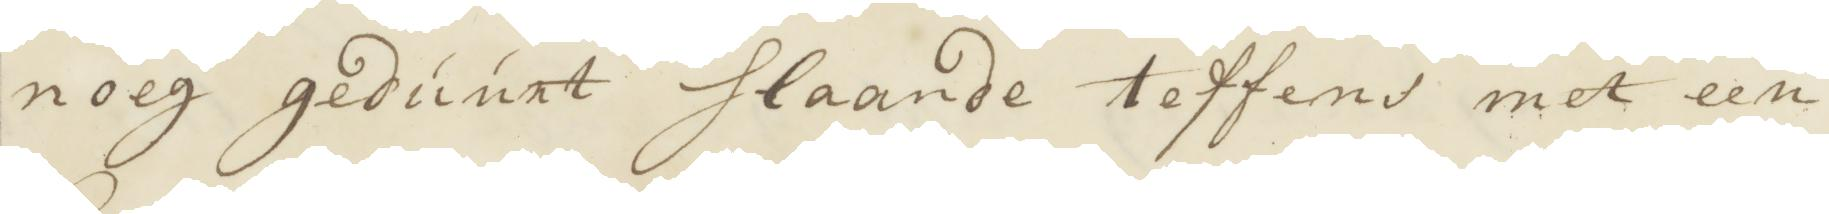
noeg geduurt slaande teffens met een
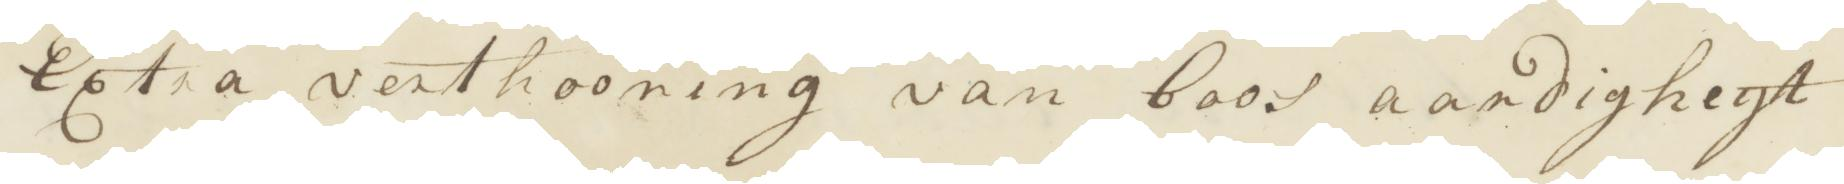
Extra verthooning van boos aardigheyt
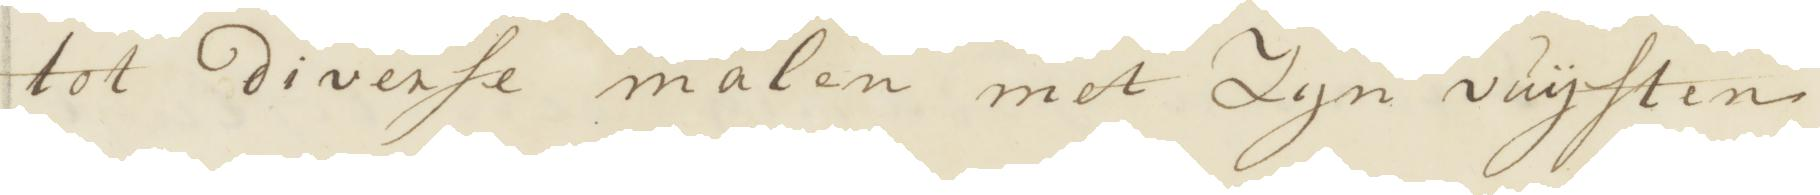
tot diverse malen met zyn vuijsten
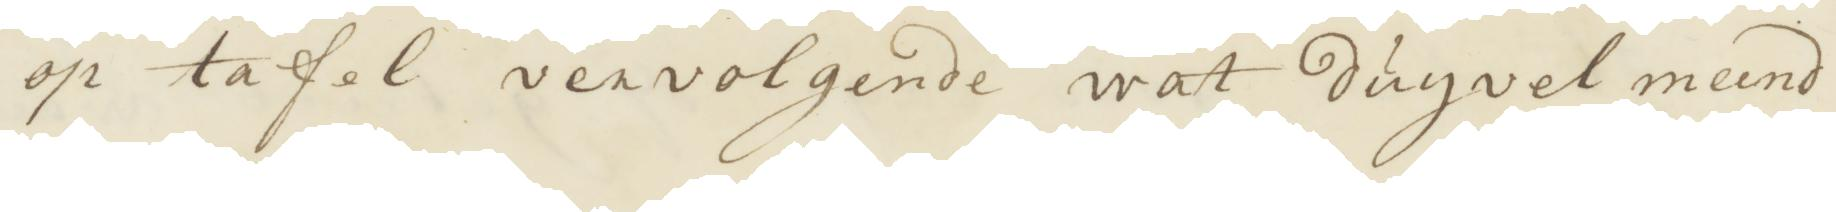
op tafel vervolgende wat duyvel meend
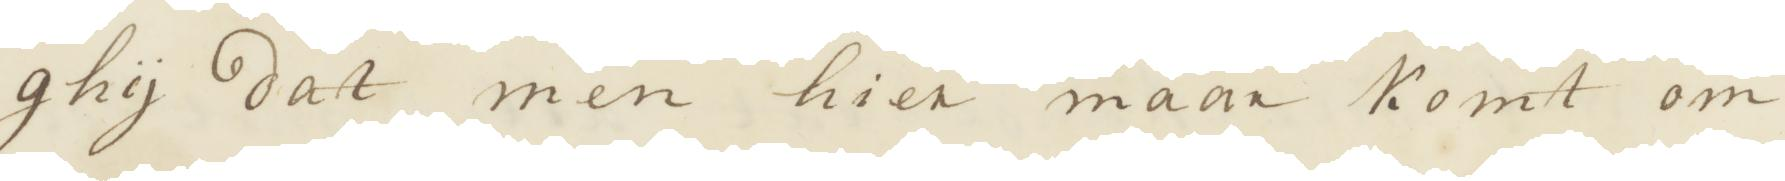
ghij dat men hier maar komt om
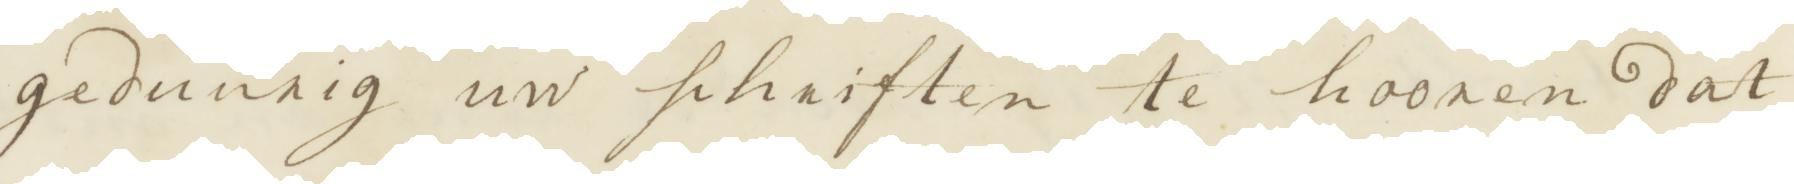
geduurig uw schriften te hooren dat
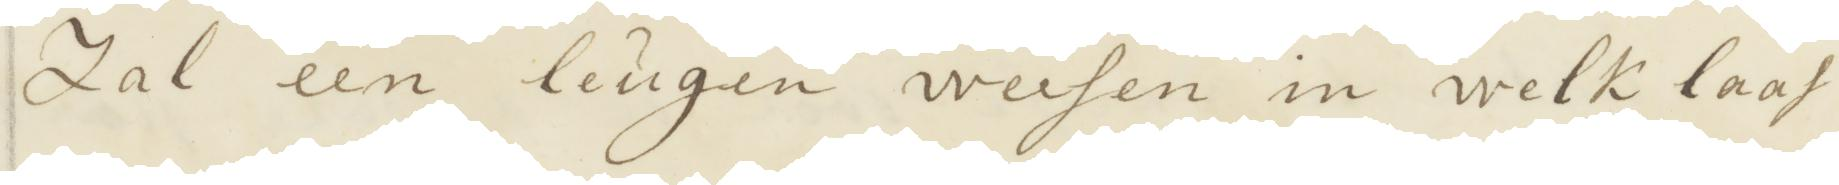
zal een leugen weesen in welk laas
